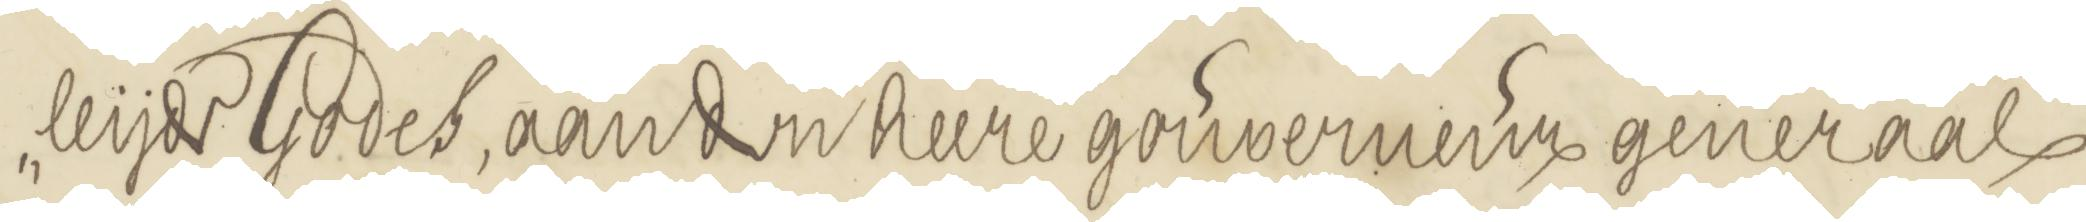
„leijde Godes, aan den heere gouverneur generaal
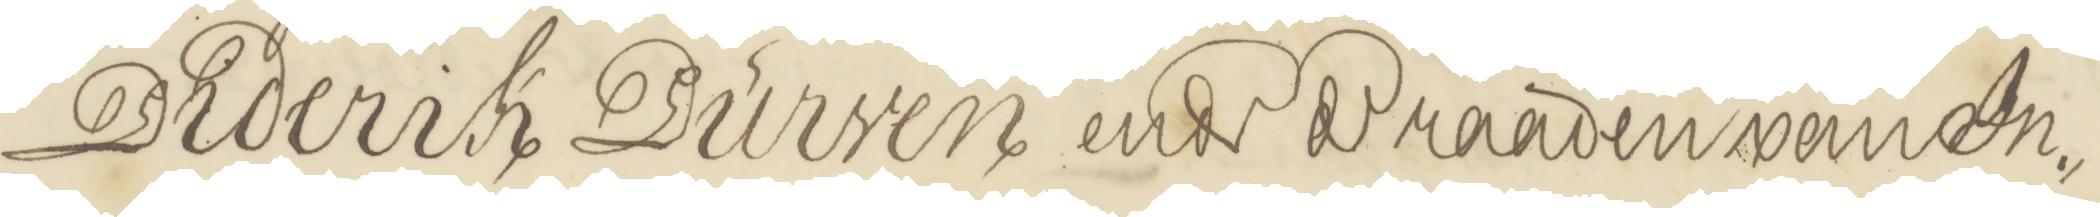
Diderik Durven ende de raaden van In„
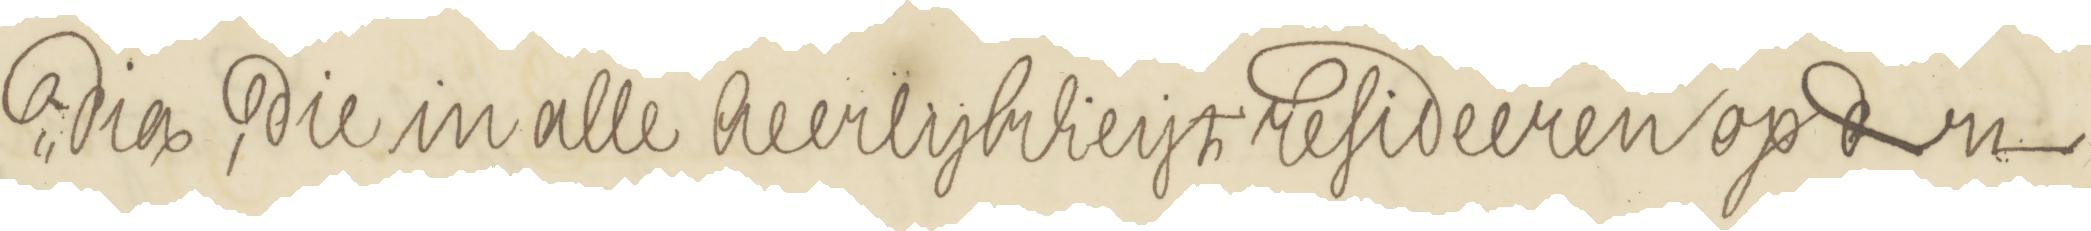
dia, die in alle heerlijkheijt resideeren op den
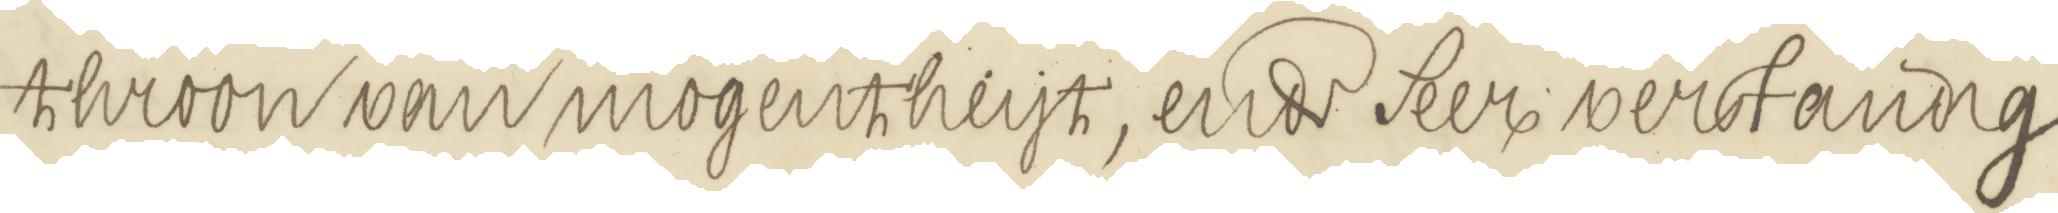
throon van mogentheijt, ende seer verstandig
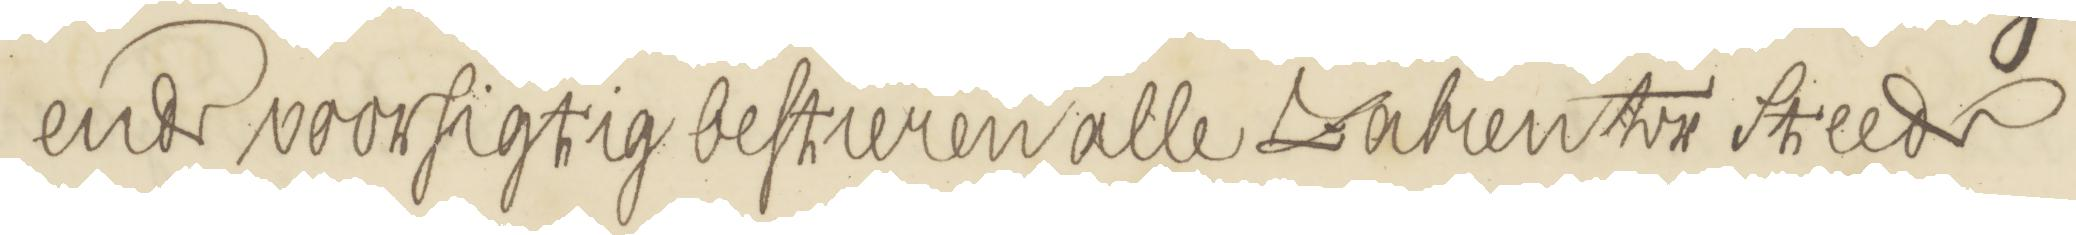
ende voorsigtig bestieren alle zaken ter steede
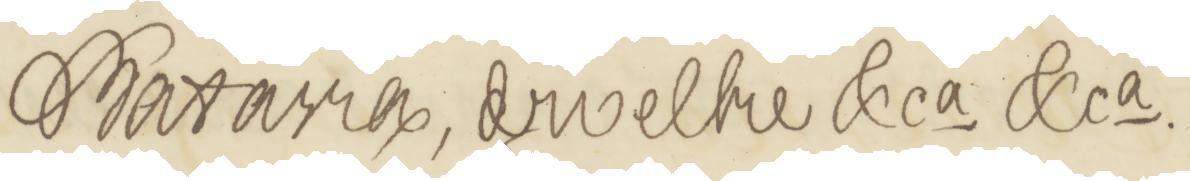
Batavia, dewelke &c-a &c-a.
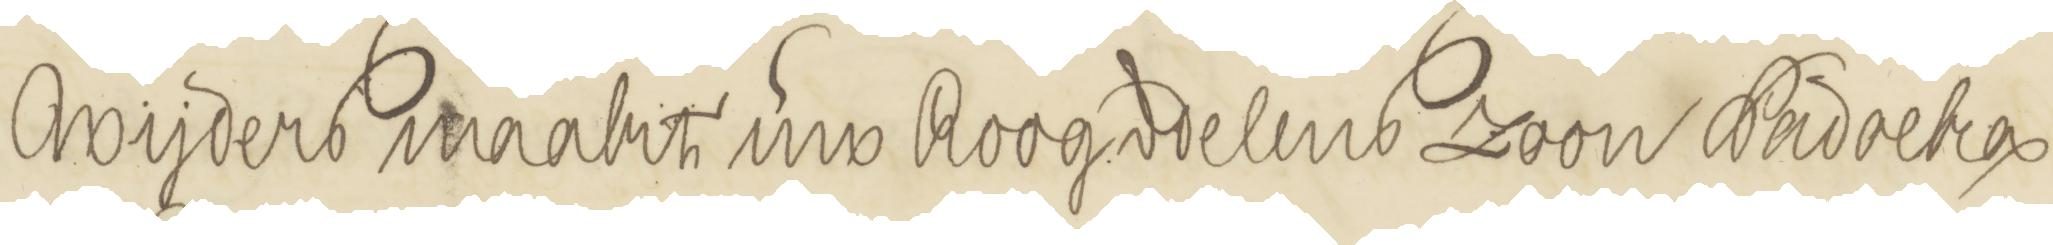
wijders maakt uw hoog edelens zoon Padoeka
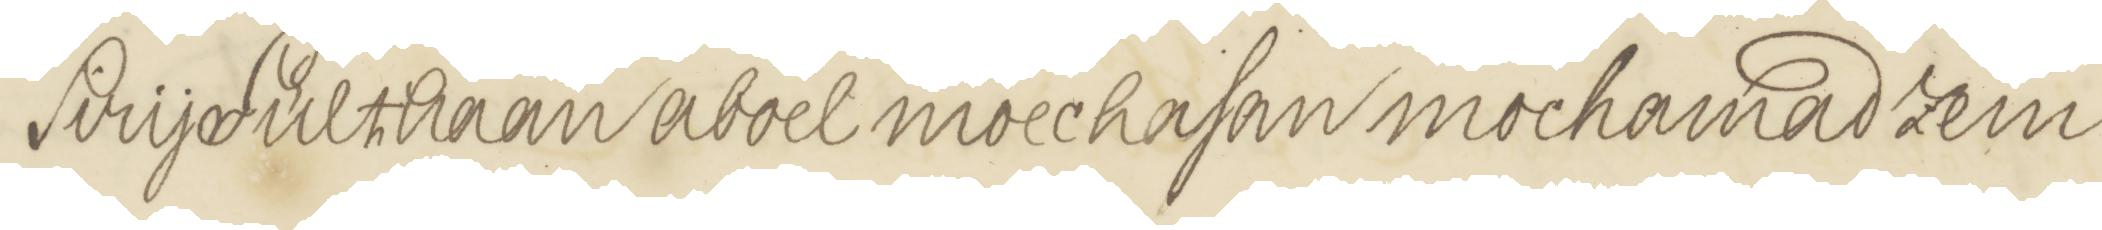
Sirij Sulthaan aboel moechasan mochamad zein
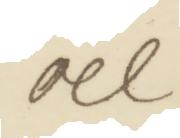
oel
